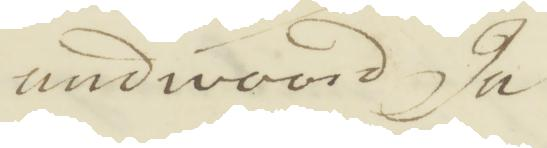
andwoord Ja
